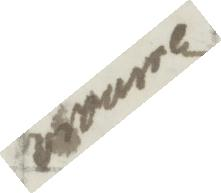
vrouwen
